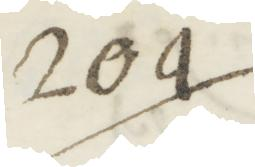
204
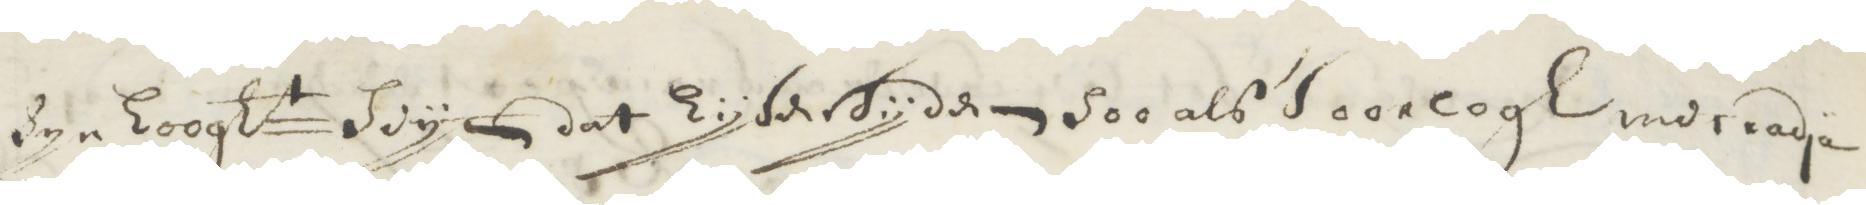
Syn hoogh=t Seijt dat hij ten tijden Soo als 't oorlogh met radja
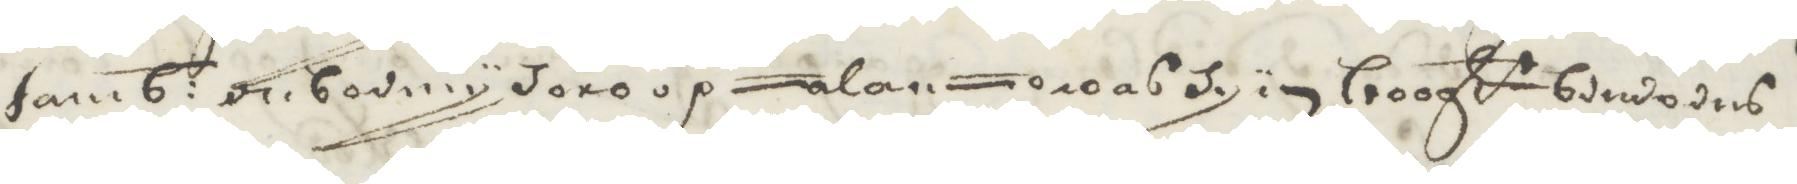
tamb: en boemij Ioro op Calan Cowas sijn hoogh=t benevens
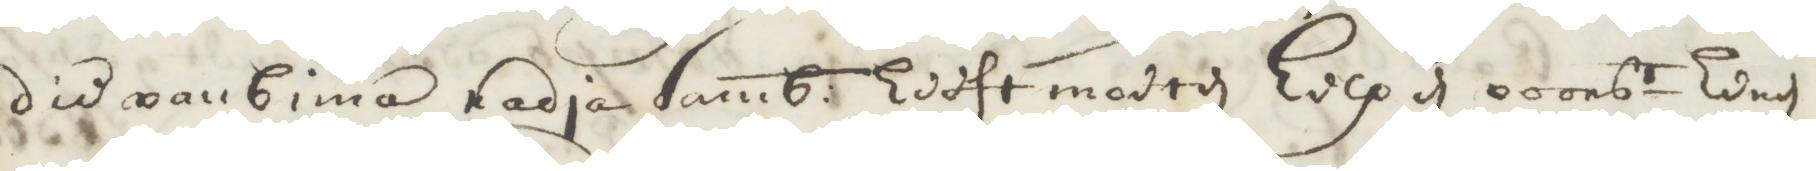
die van bima radja tamb: heeft moeten help en voors=t heren
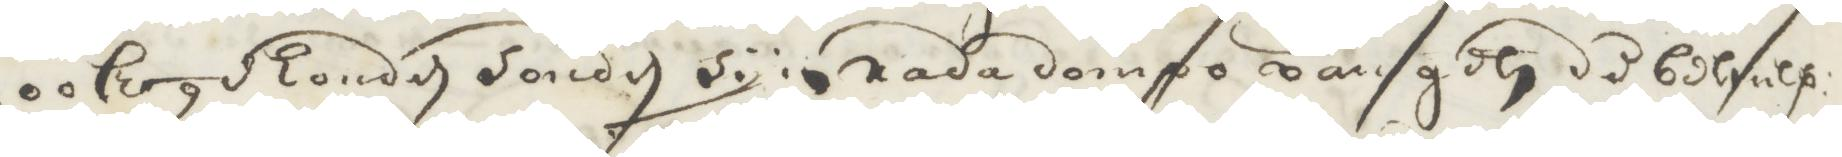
ook gehouden souden sijn rada dompo van gelijk de behulp:
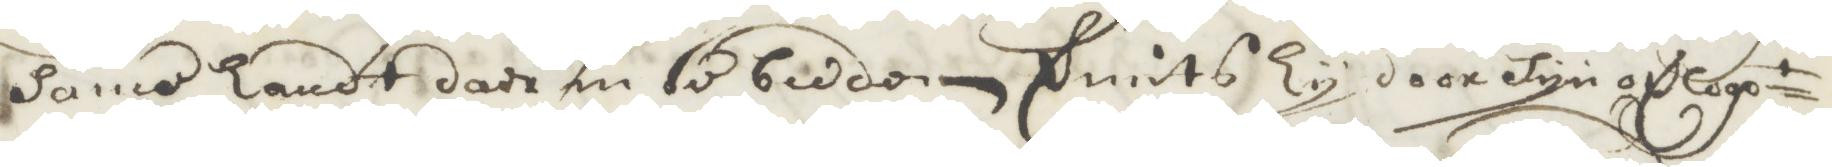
same handt daer in te bieden Vermits hij door sijn overlop=t
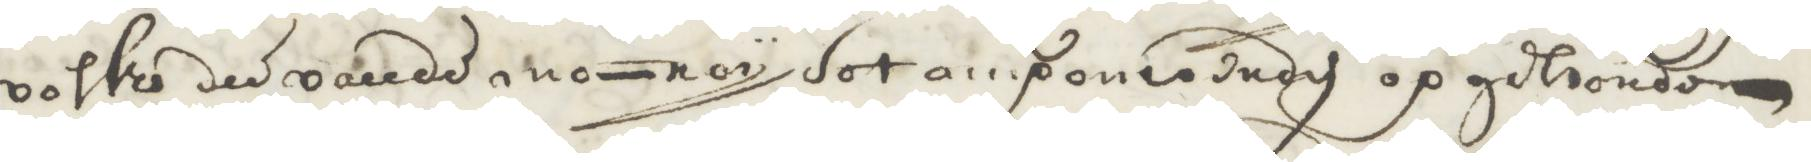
volk die vande mocroij tot ampon werden op gehouden
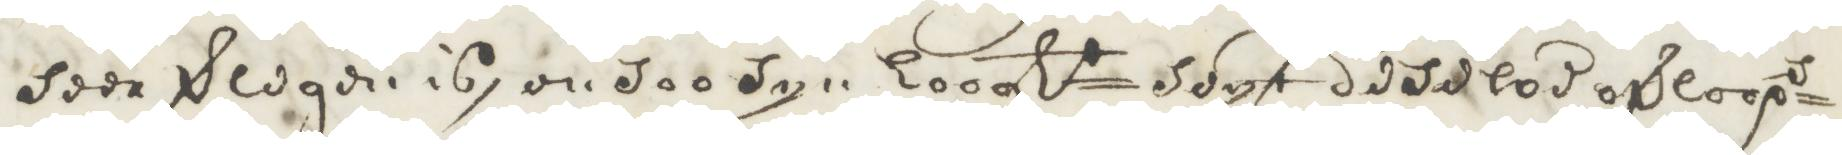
seer verlegen is, en Soo Sijn hoogh=t seyt deselve overloop=s
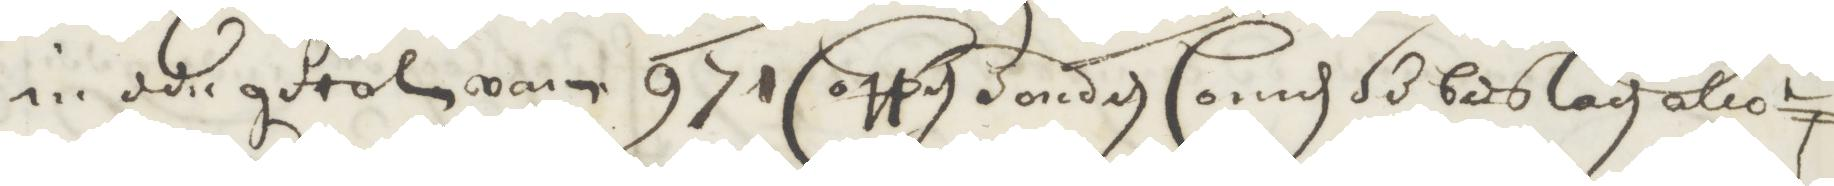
in een getal van 971 Coppen souden Comen te bestaen alw=r
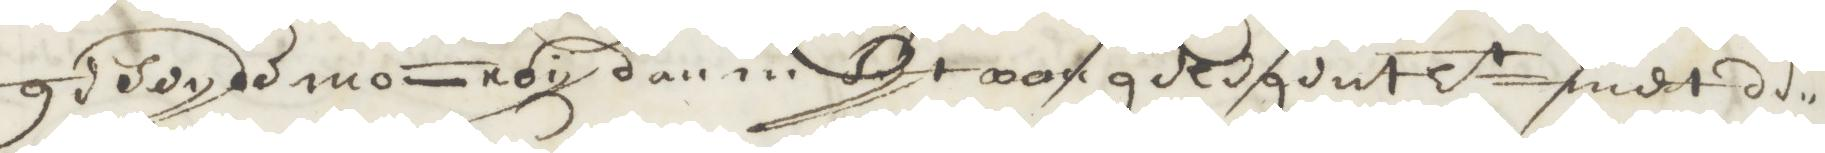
geseijde mocroij dan in tyt van gelegenth=t met de„
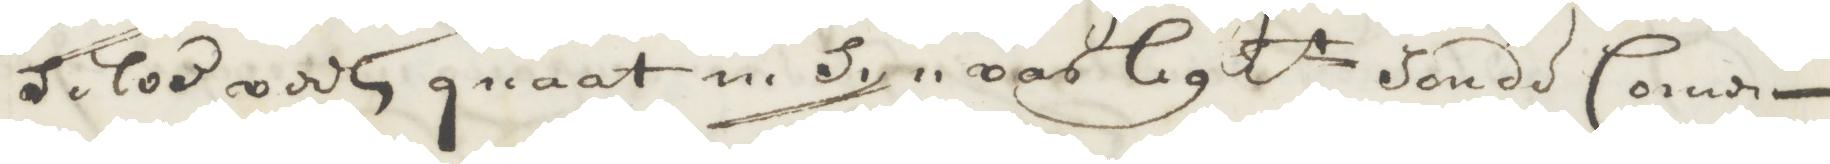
selve veel quaat in Sijn vastigh=t Soude Comen
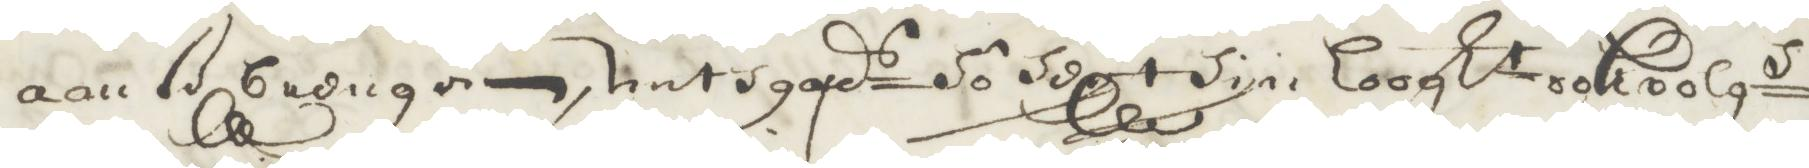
aan te brengen, mitsgad=s So het Sijn hoogh=t ook volg=s
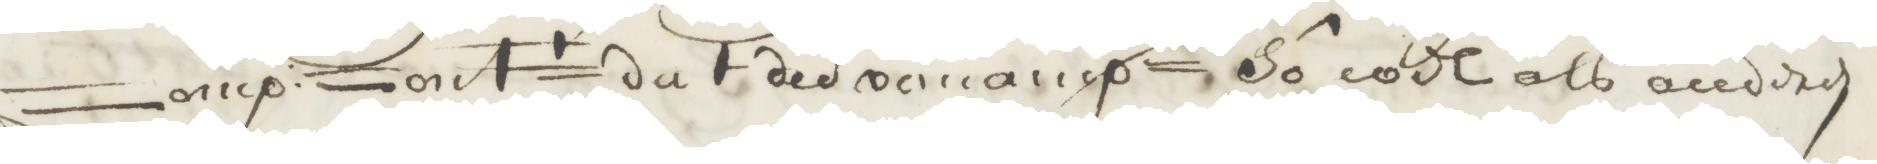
Comp:e Cont=t dat die van amp=e So wel als anderen
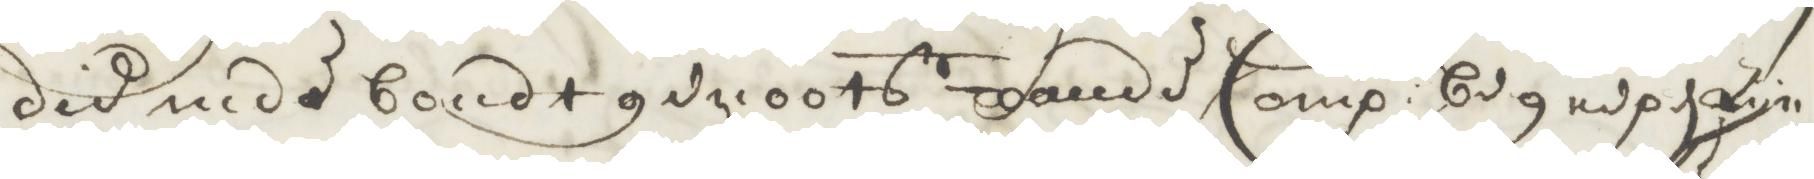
die inde bondtgenoots:p vande Comp:e begrepen Zijn
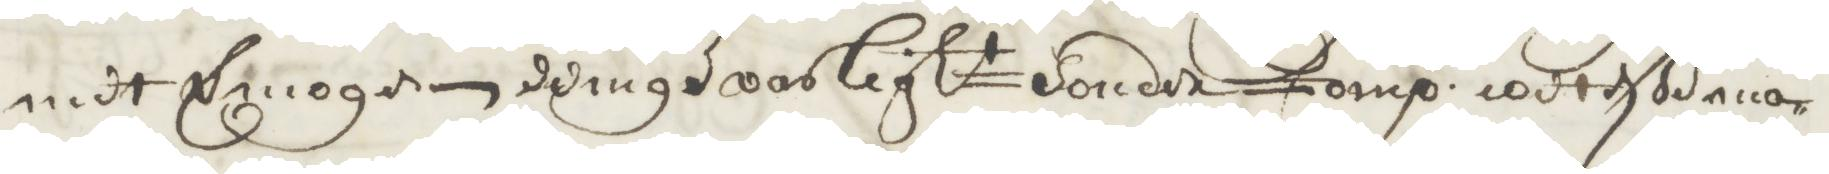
met vermogen eenige vastigh=t sonder Comp:e weten te ma„
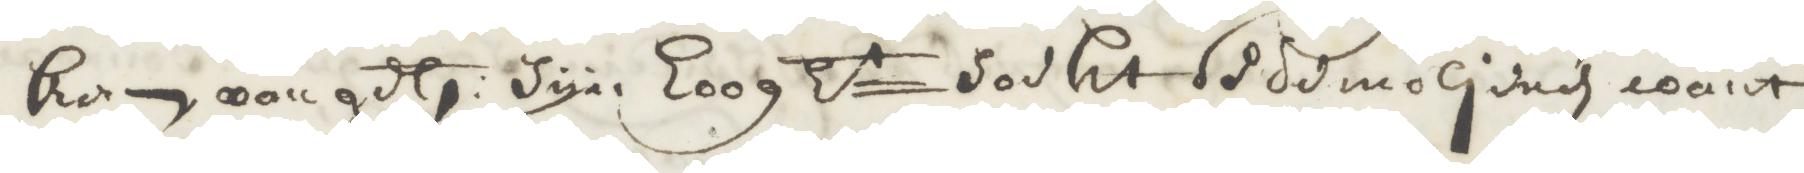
ken van gelijk Sijn: hoogh=t soekt te demoljeren want
